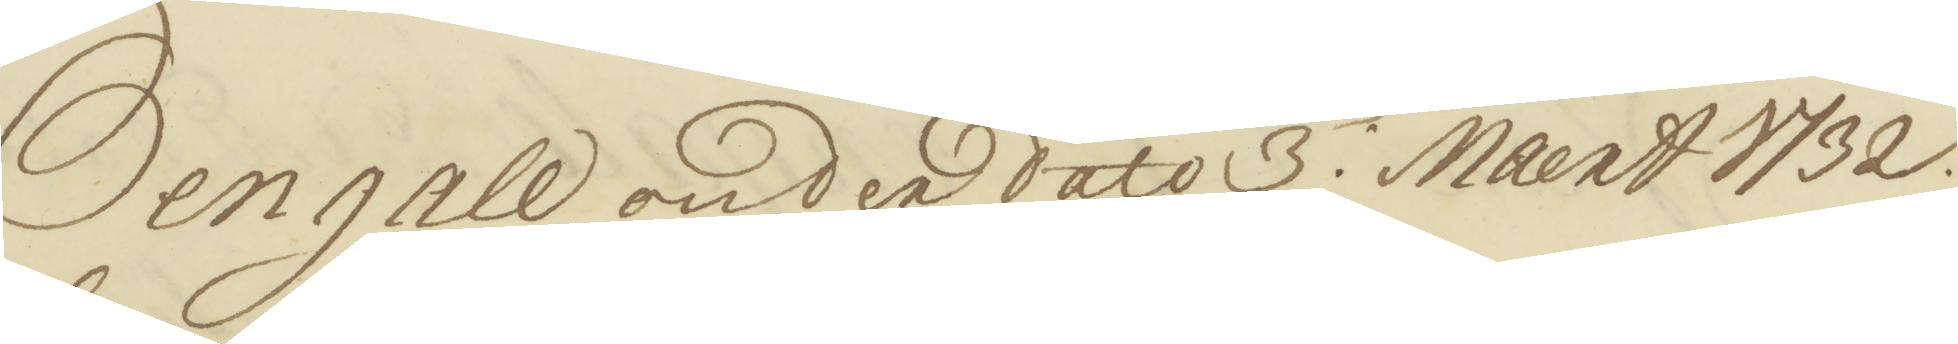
Van Bengale onder dato 3. Maert 1732.
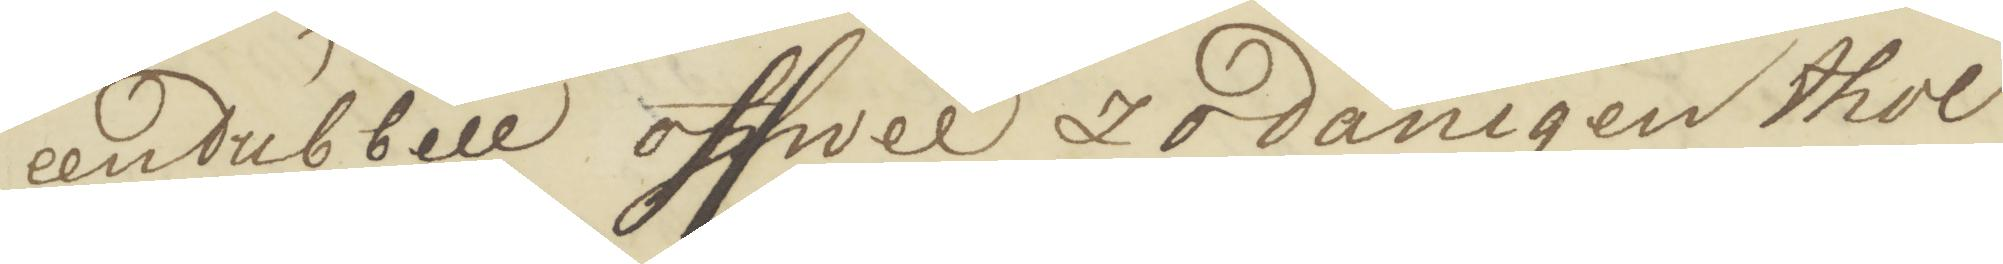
een dubbele offwel zodanigen thoe
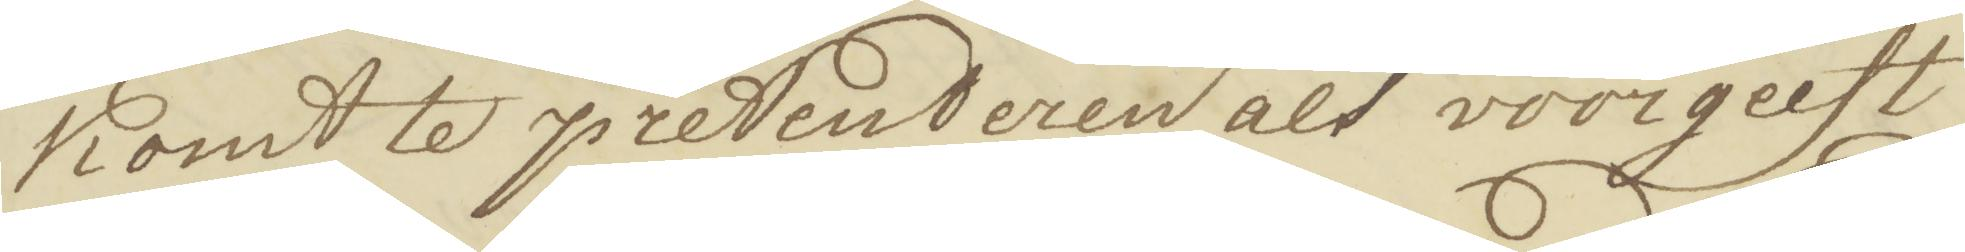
komt te pretenderen als voorgeeft
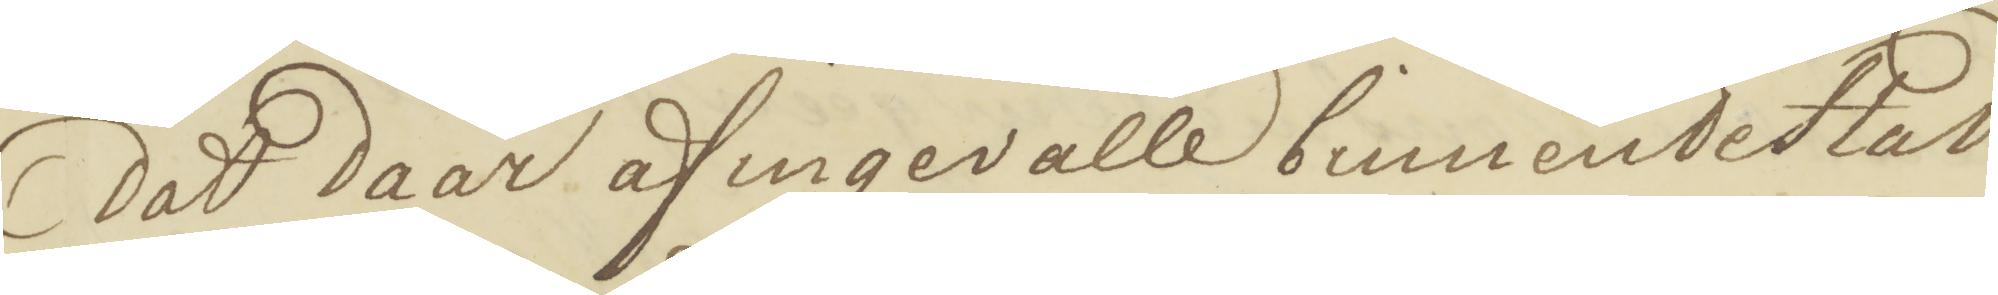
dat daar af ingevalle binnen de Stad
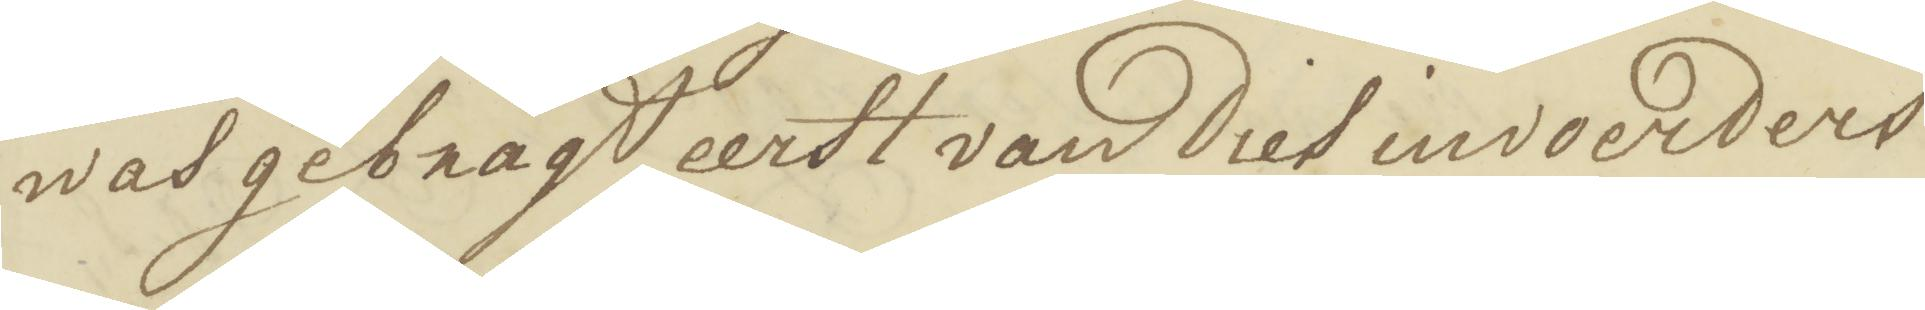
was gebragt eerst van dies invoerders
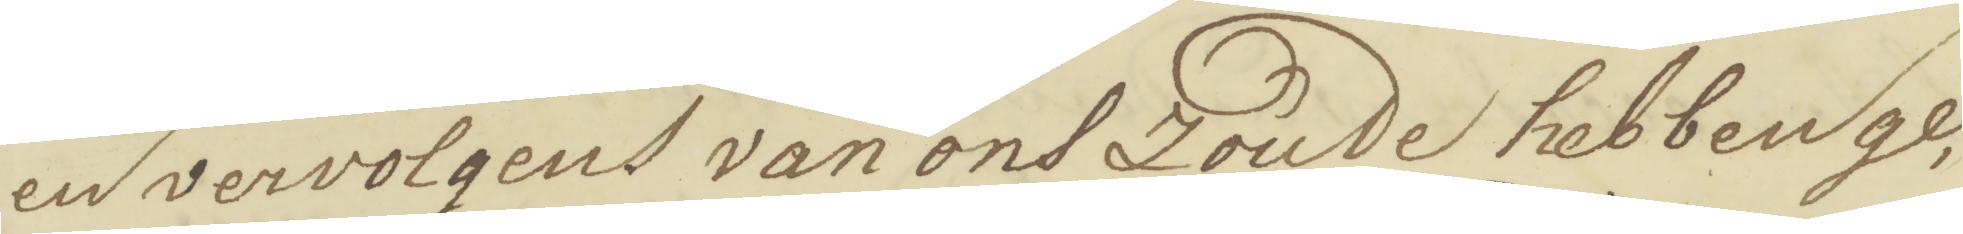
en vervolgens van ons zoude hebben ge„
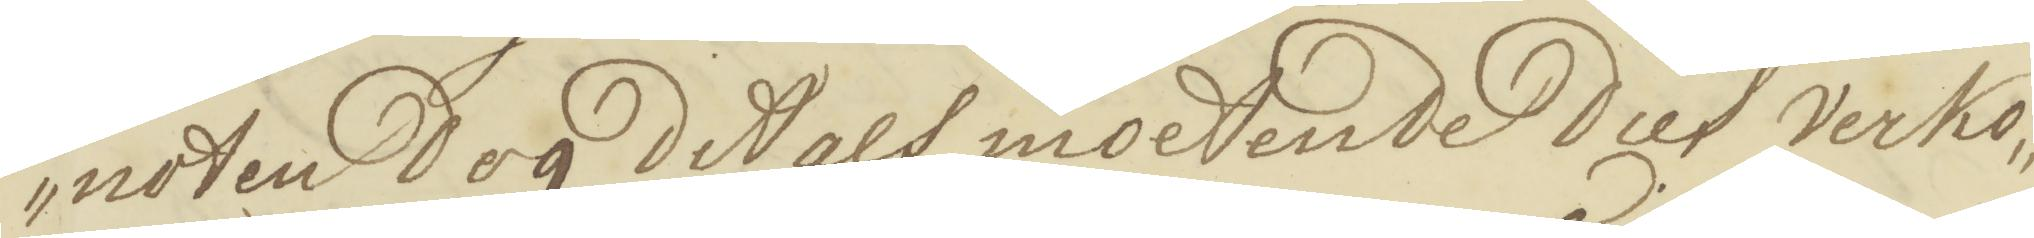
„noten dog dit als moetende dies verko„
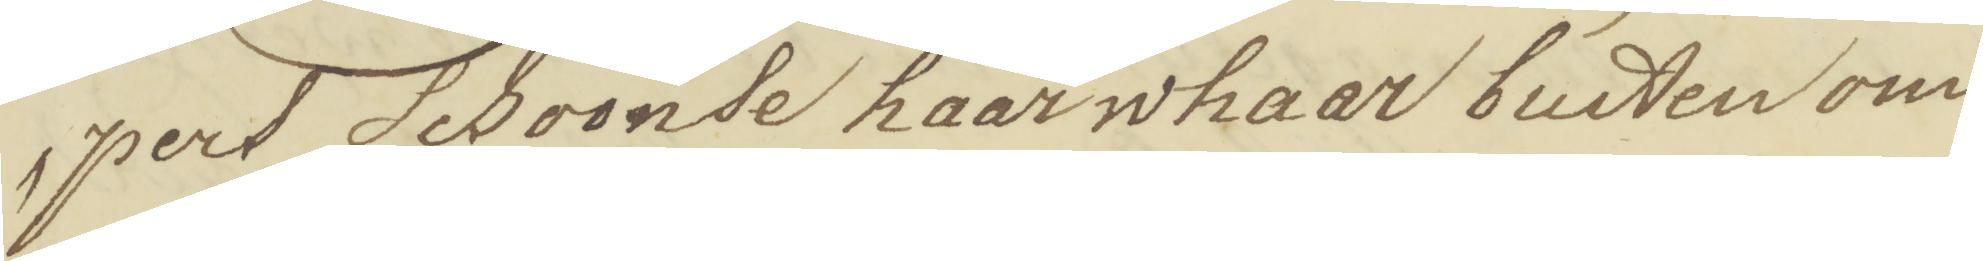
pers Schoon se haar whaar buiten om
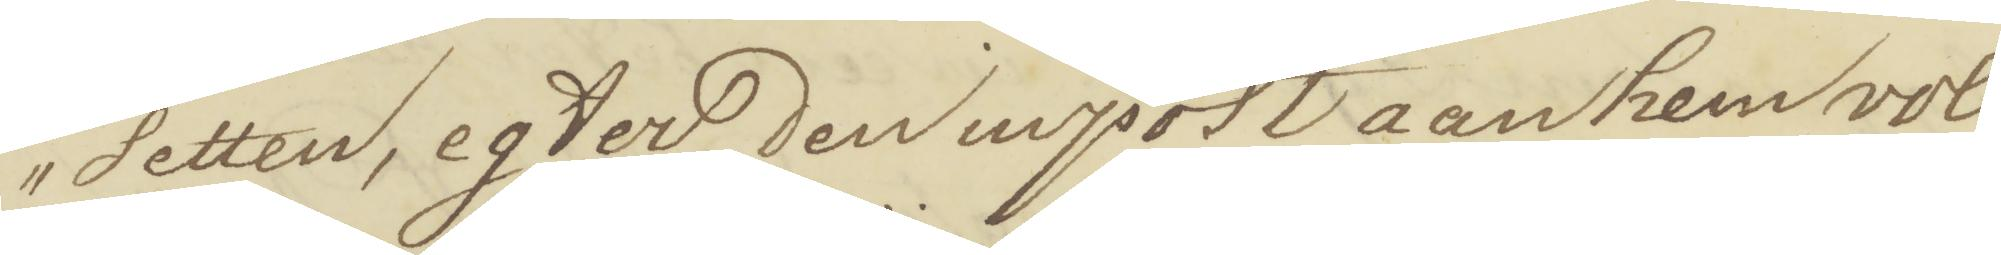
„setten, egter den inpost aan hem vol
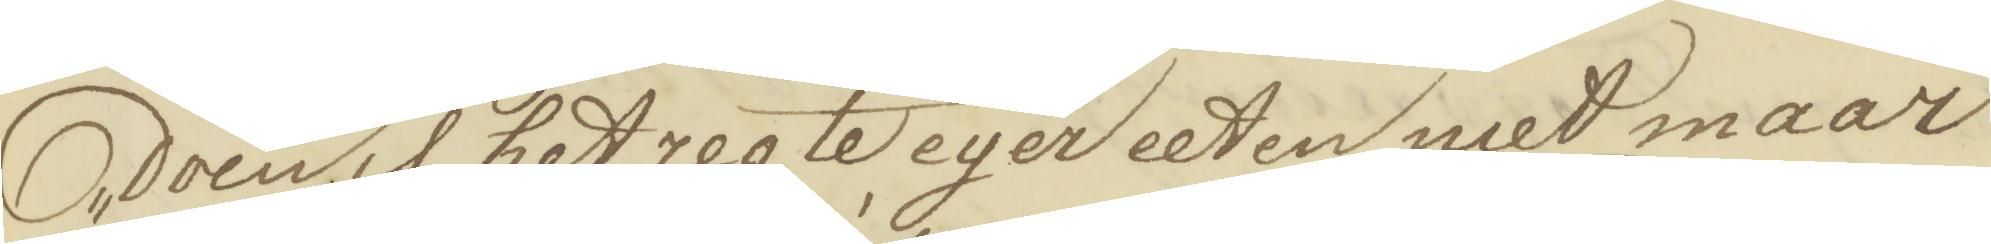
„doen is het regte eijer eeten niet maar
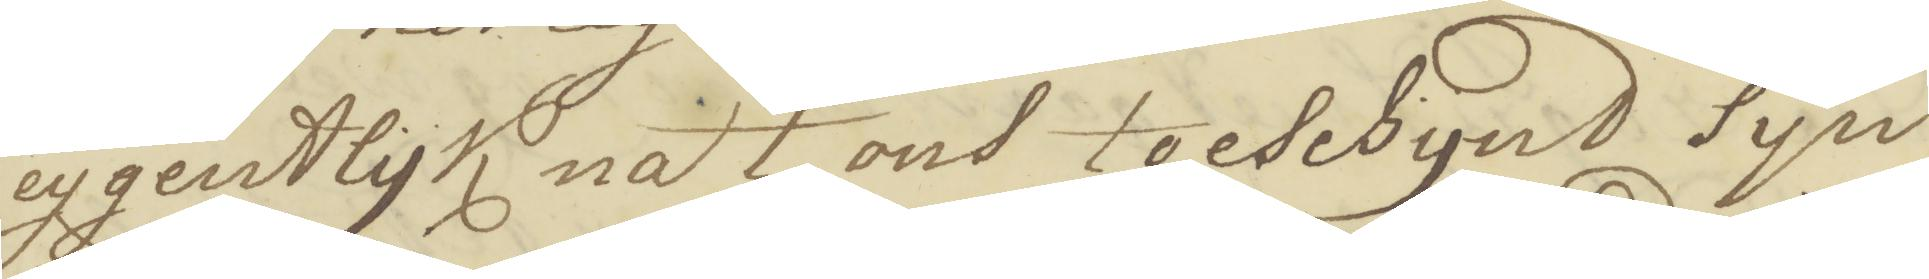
eijgentlijk na ’t ons toeschijnd sijn
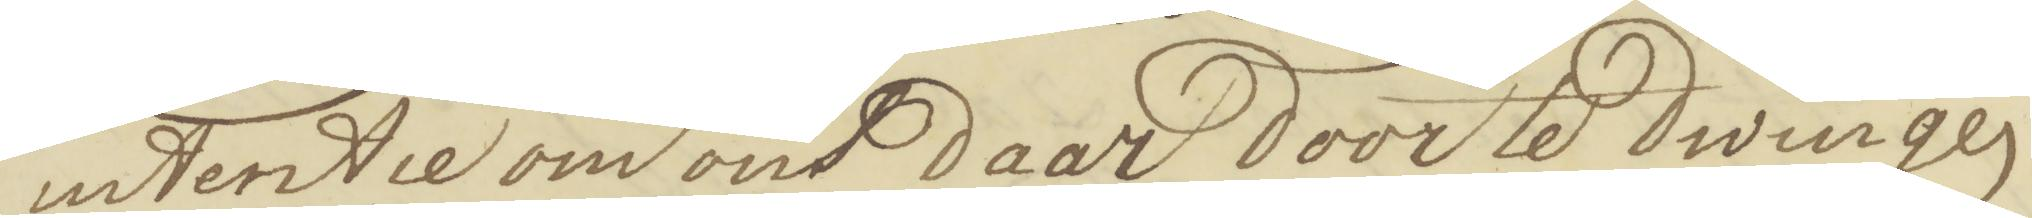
intentie om ons daar door te dwingen
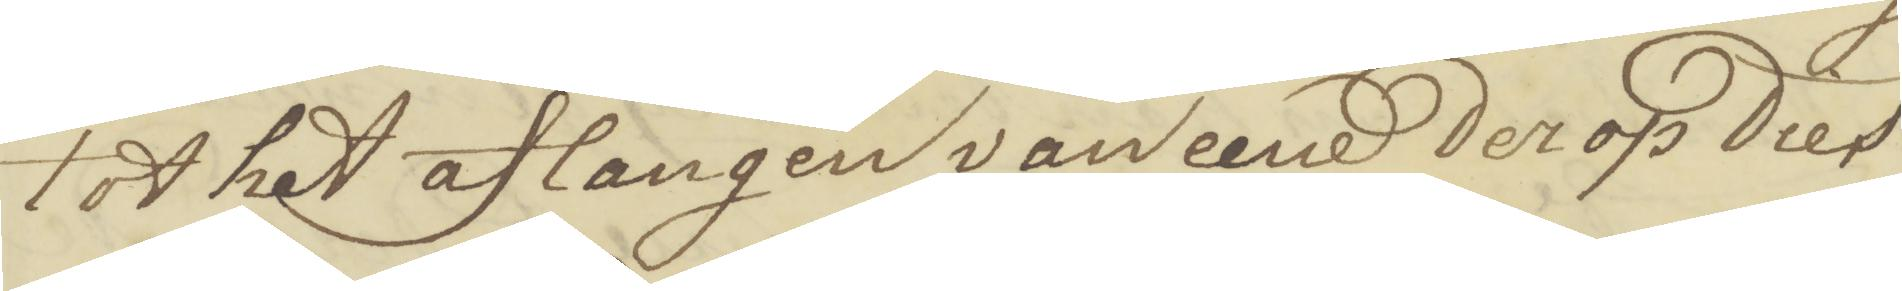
tot het aflangen van eene der op dies
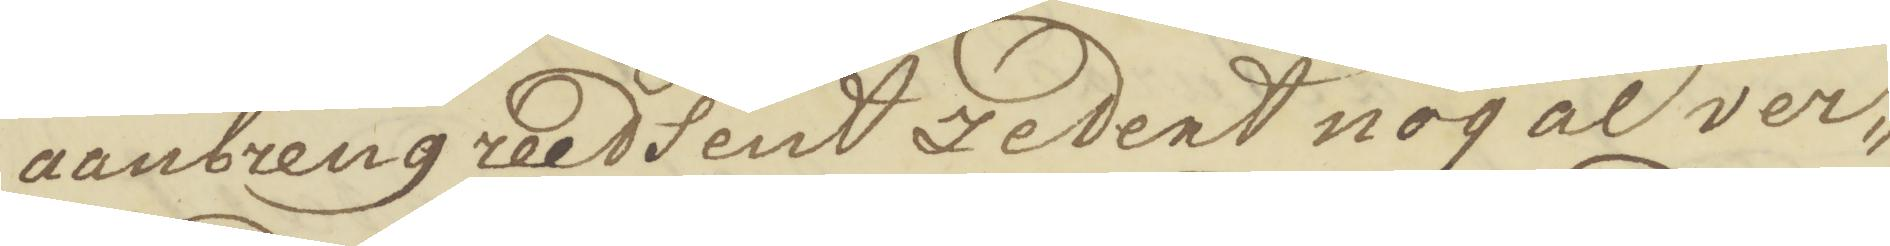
aanbreng reeds en 't zedert nog al ver„
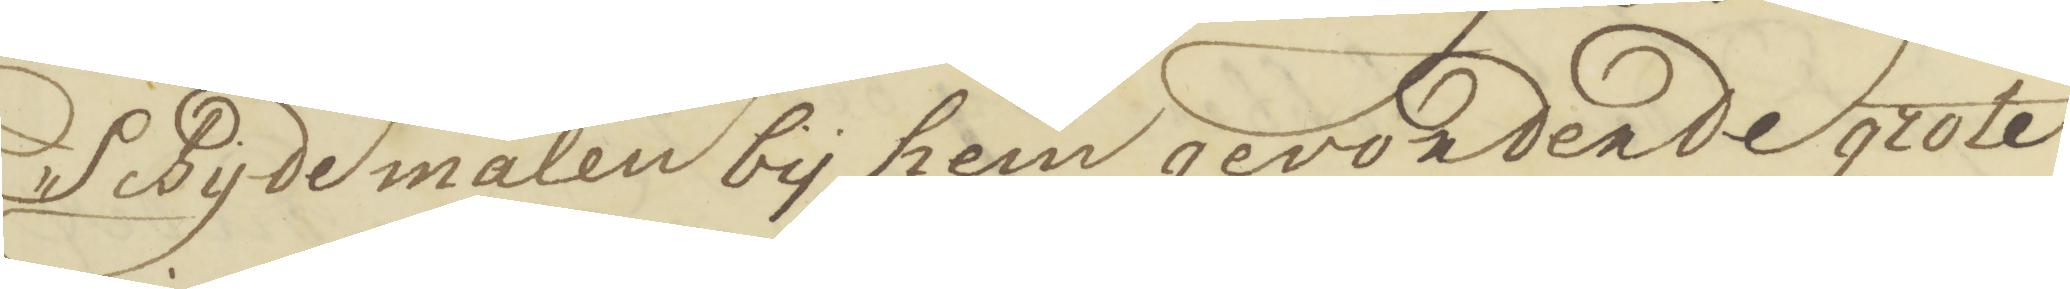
Schijde malen bij hem gevorderde grote
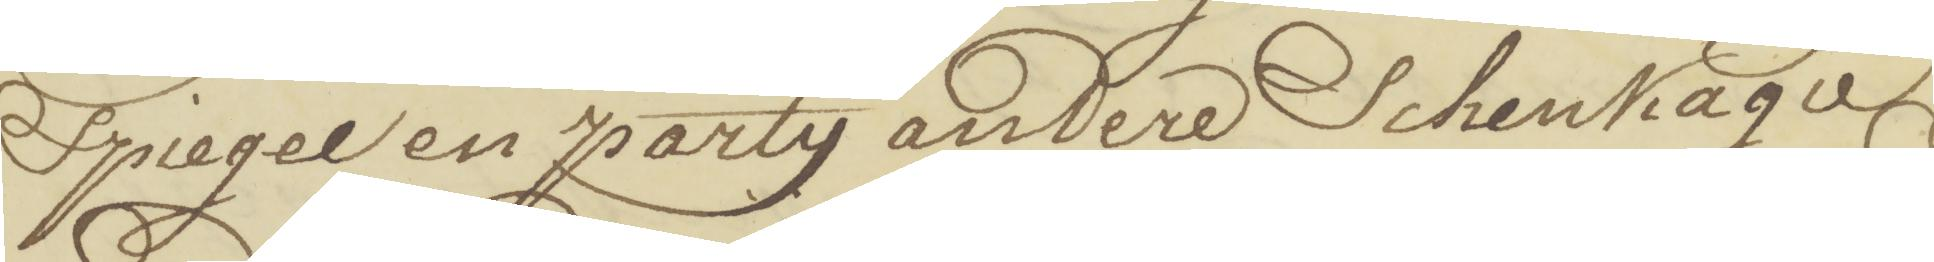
Spiegel en partij andere Schenkagie
